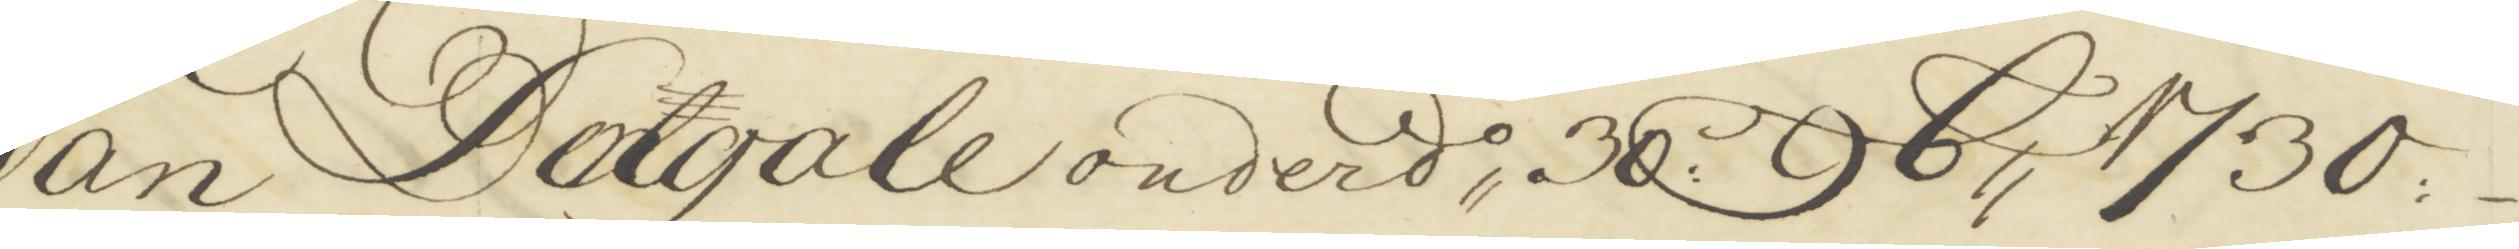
Van Benlgale onder d„o 30:' 9b„' 1730:-
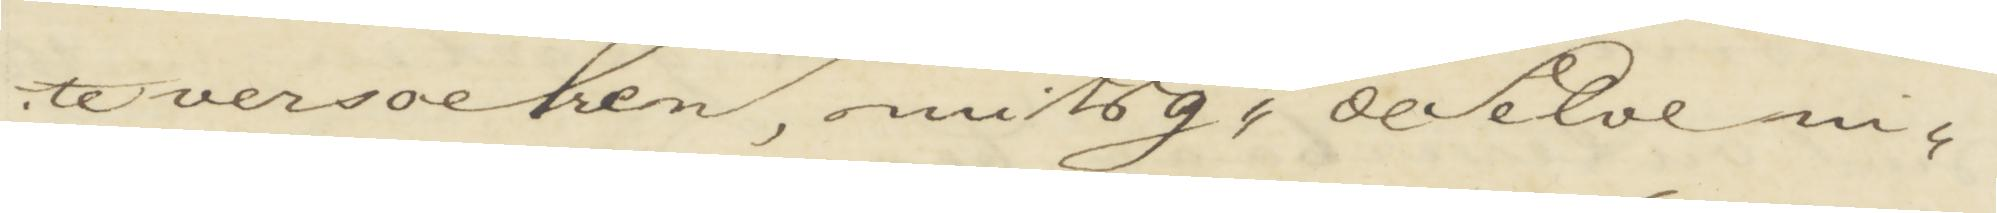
„te versoeken, mitsg„s de Selve in„
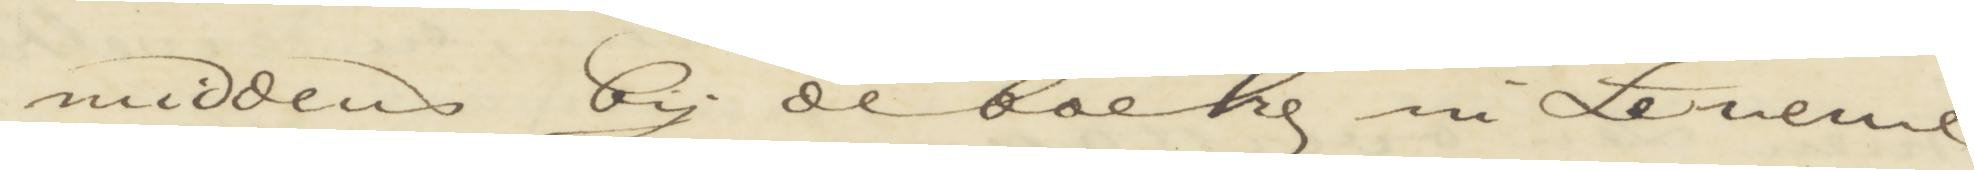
middens bij de boeke in te nemen
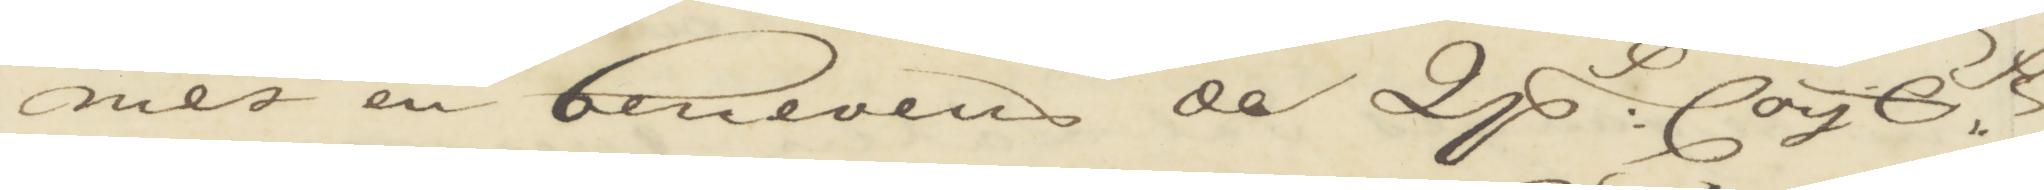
met en benevens de 2 p:s Coijl„s
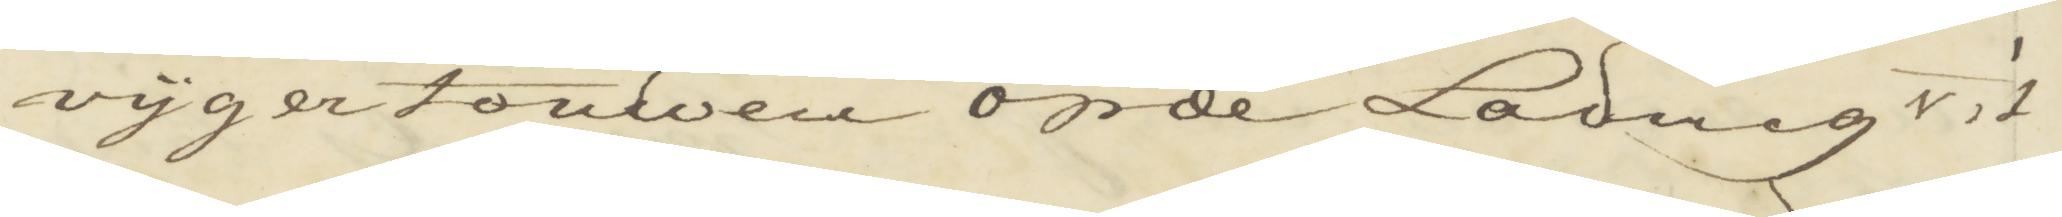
vijger touwen op de Lading n, 1'
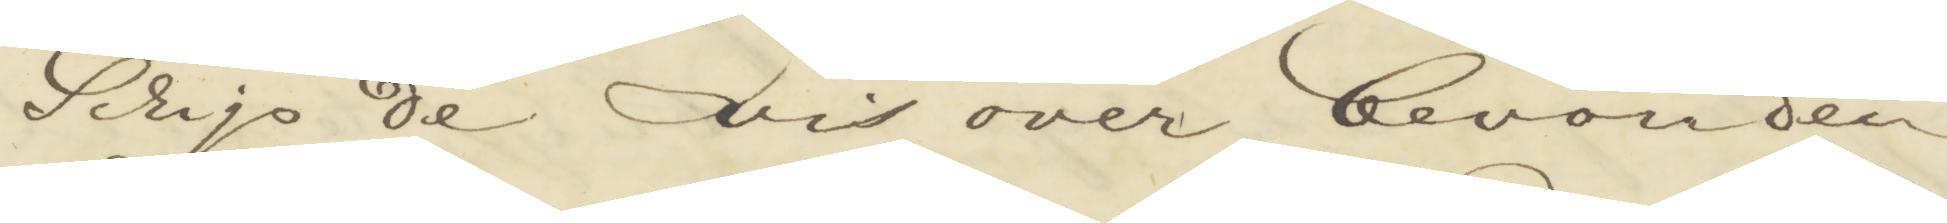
Schip de vis over bevonden
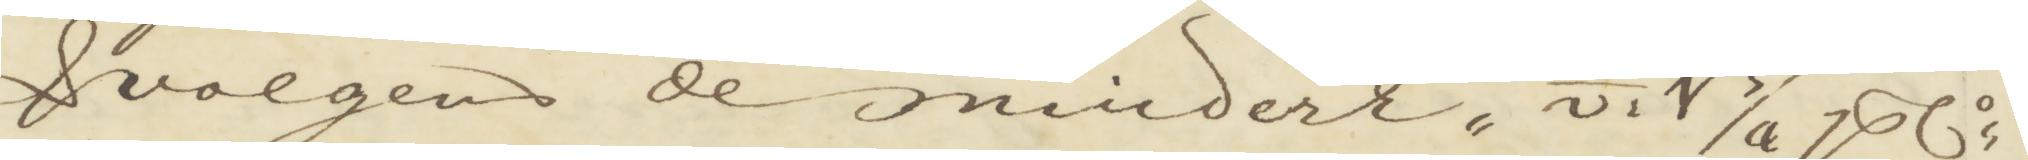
vervolgens de minderh„d v: 1¾ pC„o
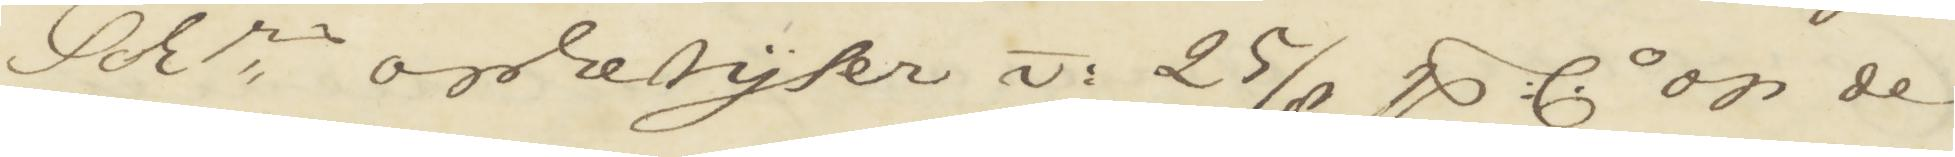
Sch„rs op het ijser /v: 25/8 p: C.o= op de
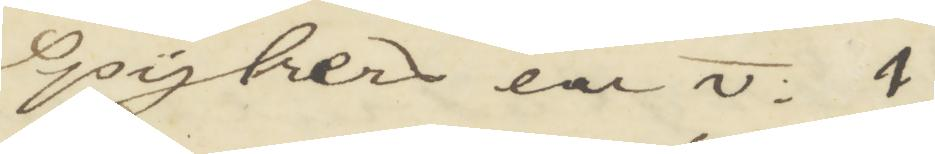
Spijker en v: 1 15/16 pC„o op het
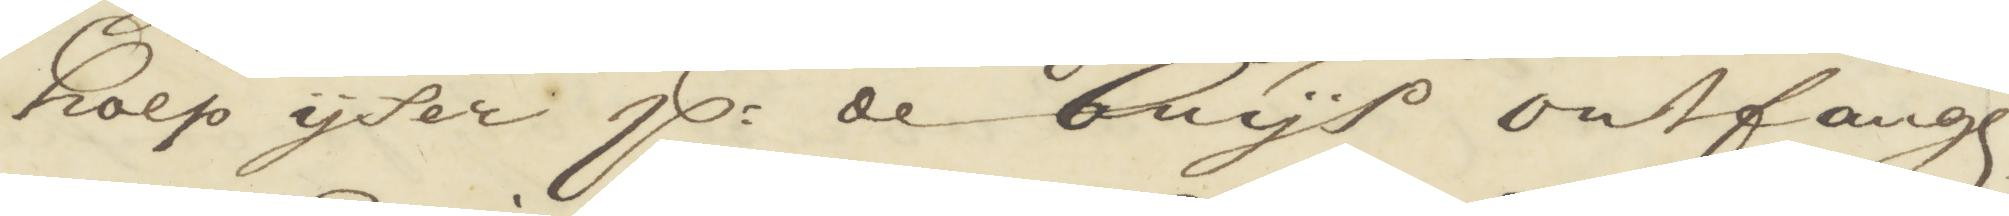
hoep ijser p: de buijs ontfangen
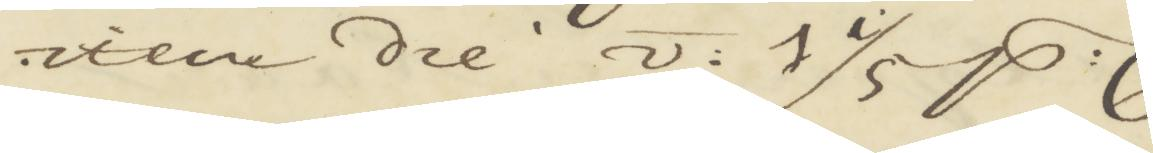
.item die v: 1 1/5 p: C:o
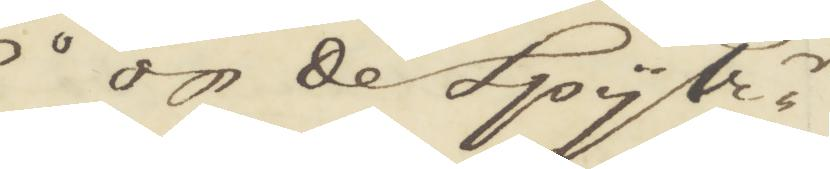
op de Spijk:rs
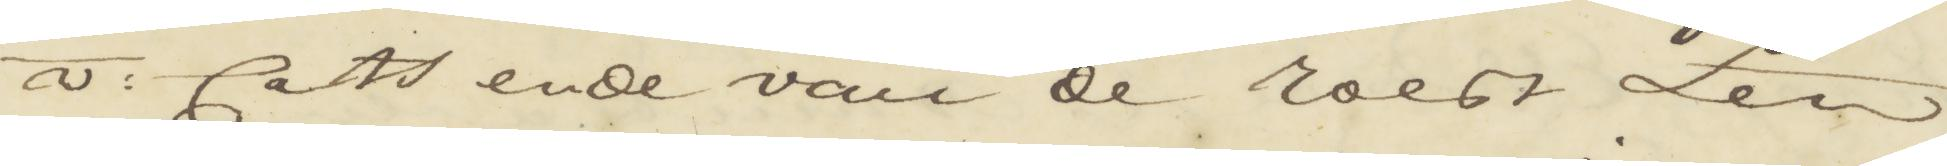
v: Cats ende van de roest ten
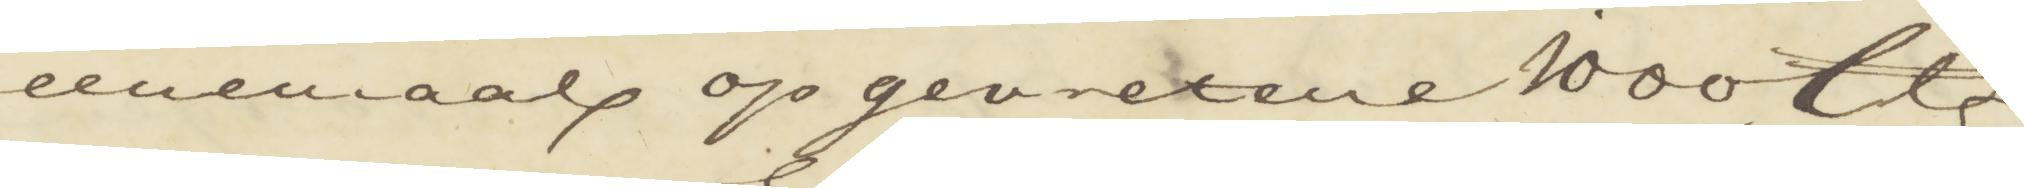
eenemaal op gevretene 1000 lb:
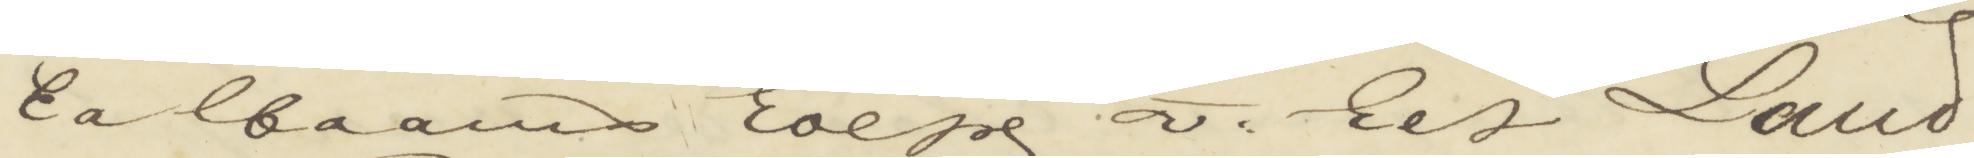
Ca lb aams hoepen v: het Land
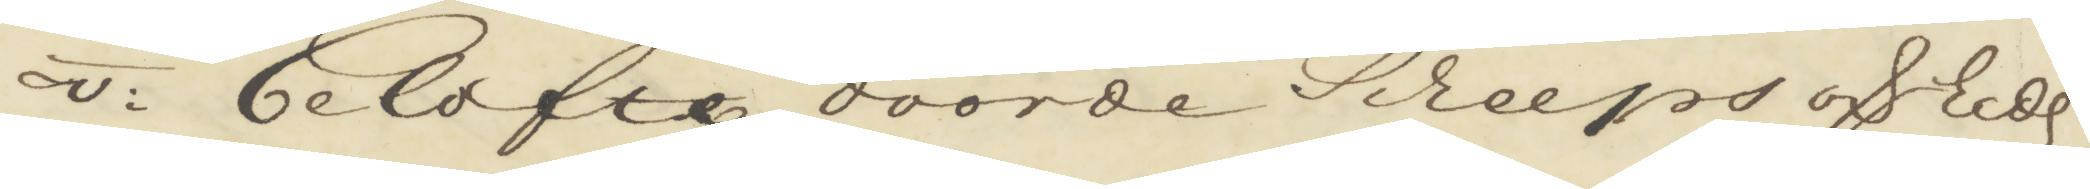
v: belofte door de Scheeps overheden
